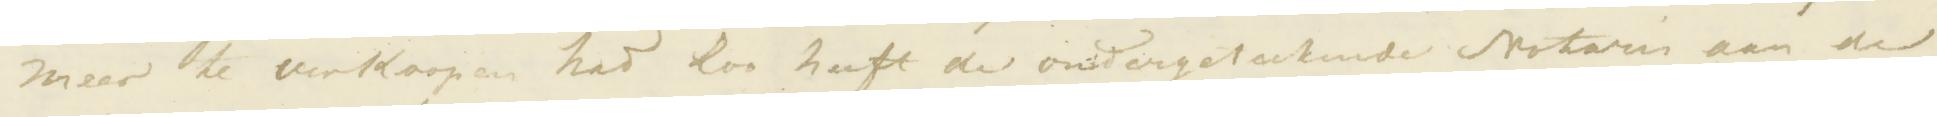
meer te verkoopen hed zoo heeft de ondergeteekende Notaris aan de
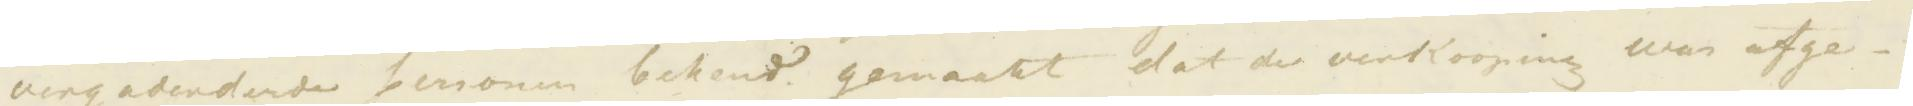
vergadenderde personen bekend. gemaakt dat de verkooping was afge-
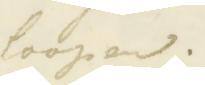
loopen.
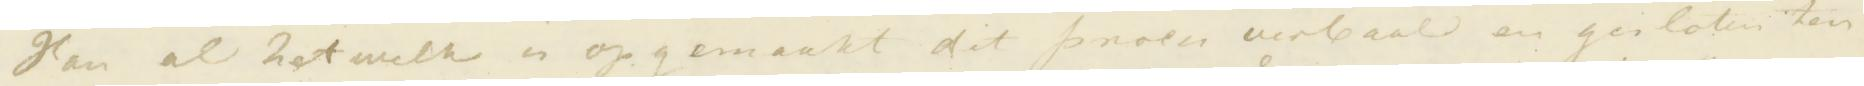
Van al het welk in opgemaakt dit proces verbaald en gesloten ten
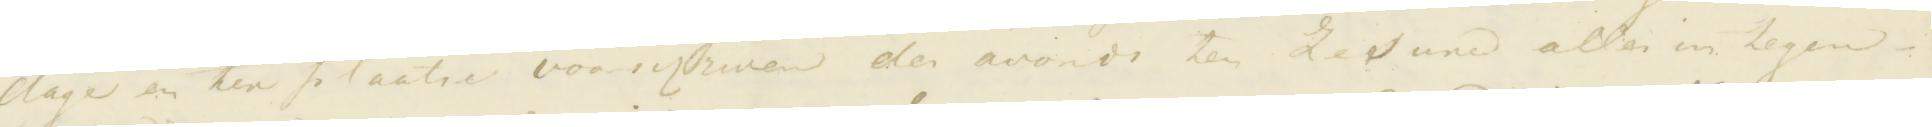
dage en ten plaatse vooschwen der avonds ten Zesure alles in tegen=
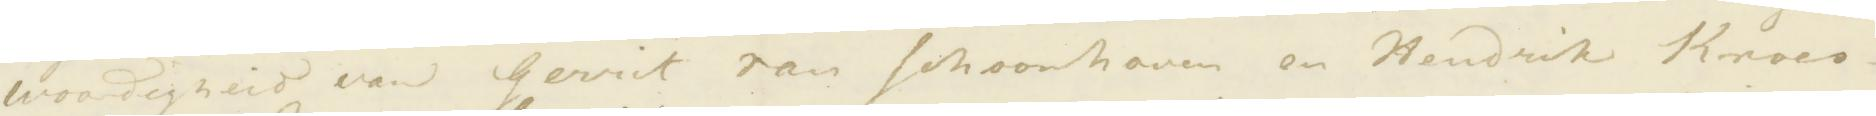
woodigheid van Gerrit van Schoonhoven en Hendrik Kroes.
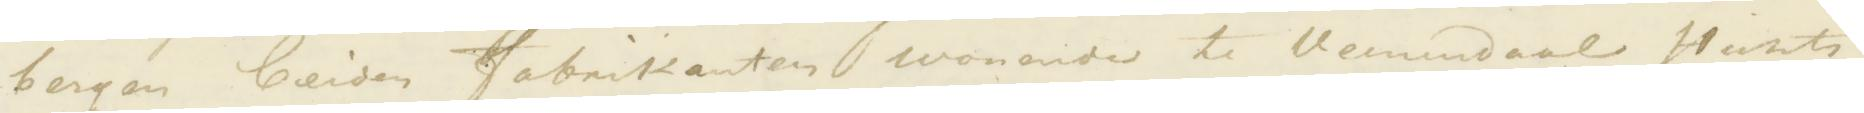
bergen beiden Fabrikanten wonende te Veenendaal stants
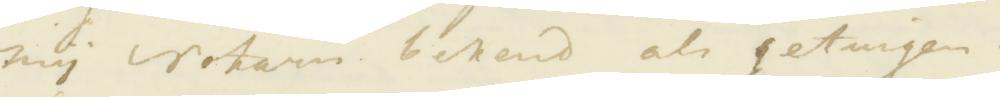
mij Notaris bekend als getuigen.
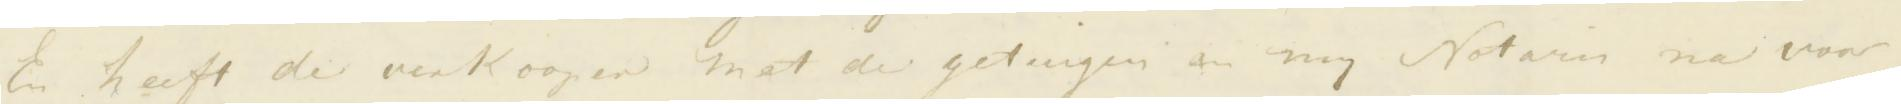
En heeft de verkoopen met de getuigen en mij Notaris na voor
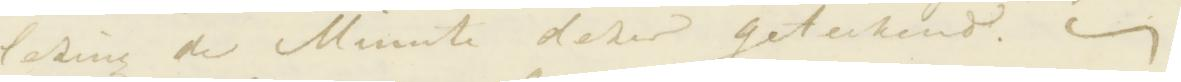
lazing de Minute dezer geteekend.~
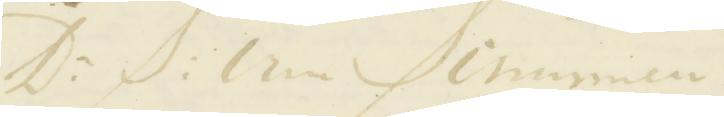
D: S: Van Simmien
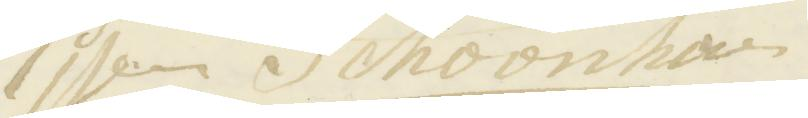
Gsen Schoonhoven
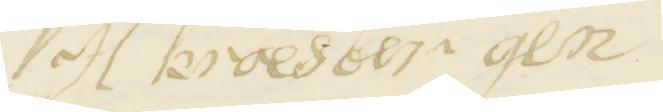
H kroesbergen
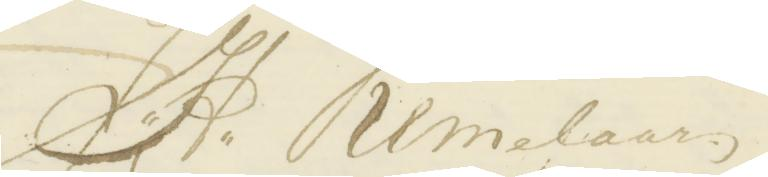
J„H„ Kemelaar
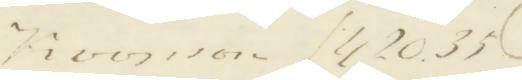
Konnson ƒ 420.35
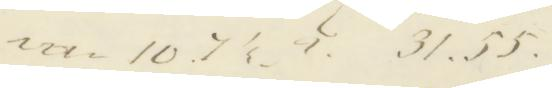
van 10.7½ r. 31.55.
